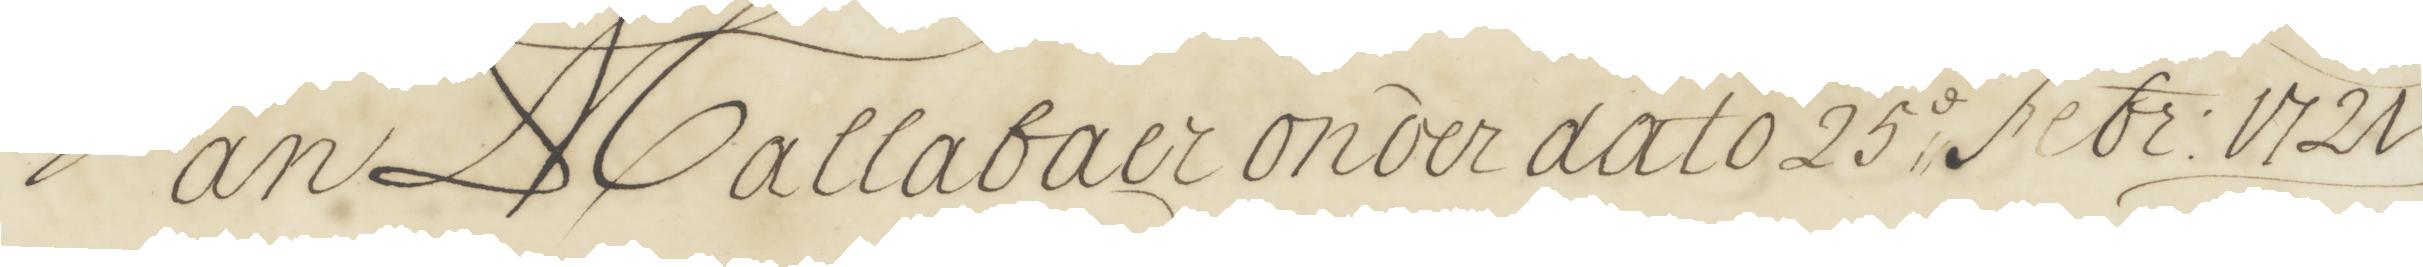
Van Mallabaer onder dato 25„e Febr: 1721
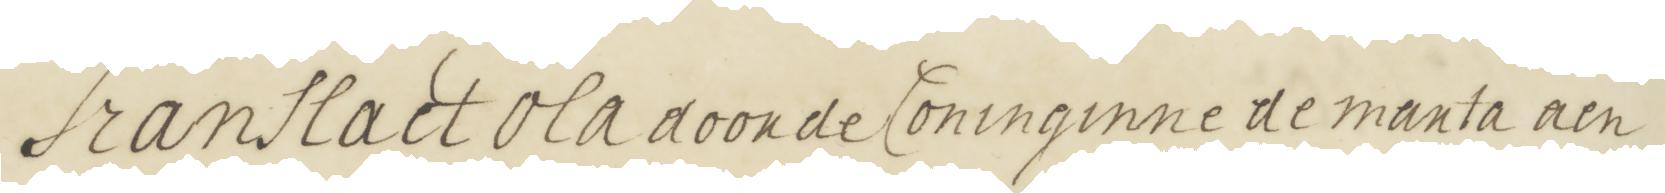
Translaet ola door de Coninginne de marta aen
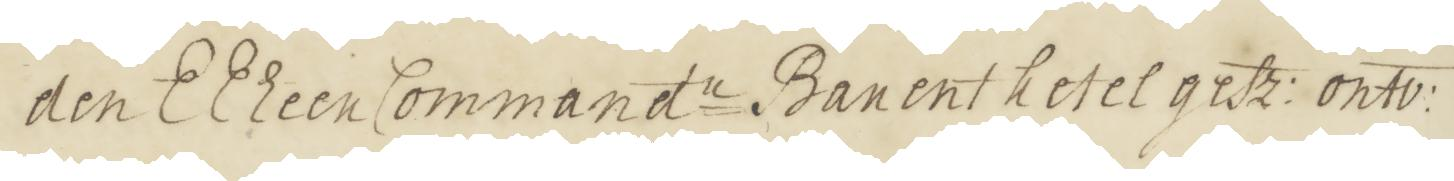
den EEheer Command=r Barent ketel gesz: ontv:
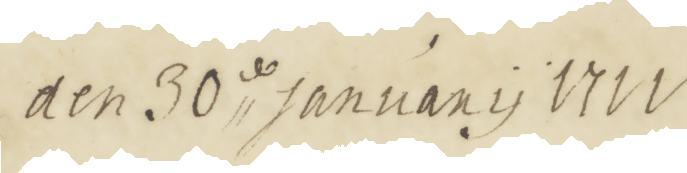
den 30„e januarij 1711
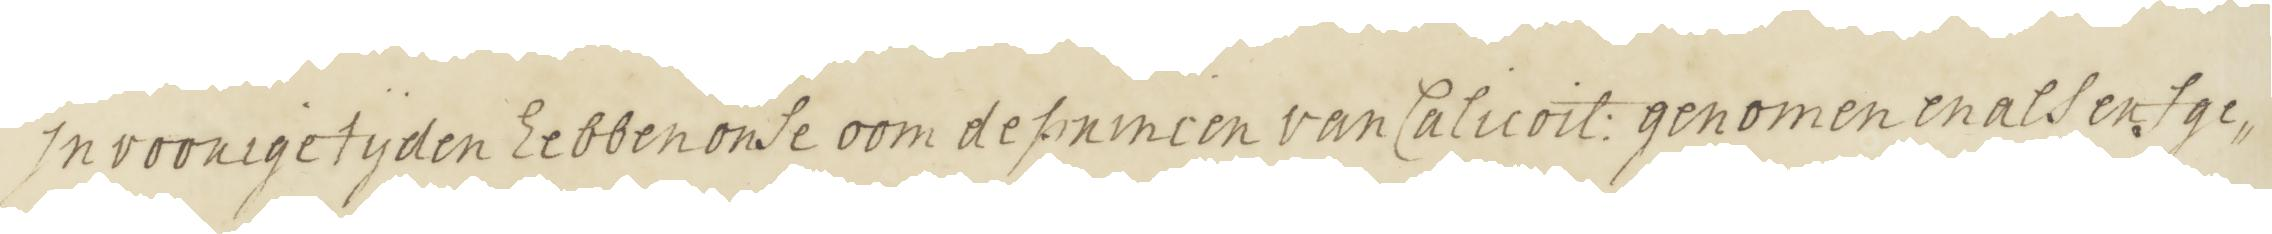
Jn voorige tijden hebben onse oom de princen van Calicoil: genomen en als erfge„
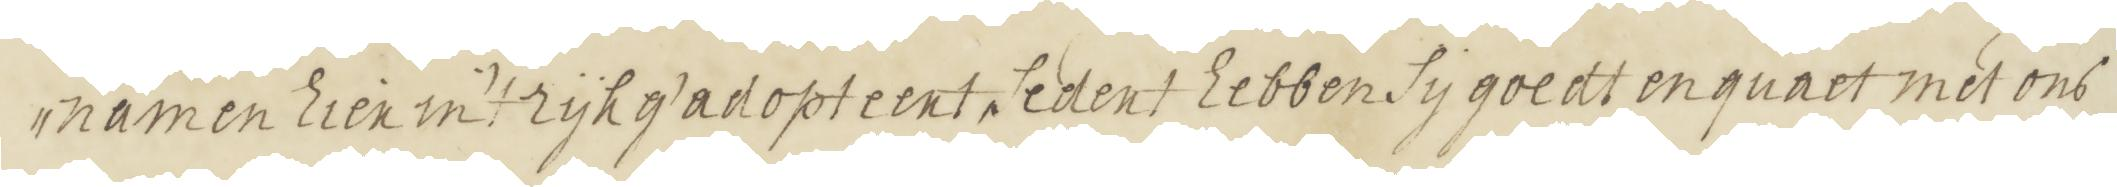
„namen hier in't rijk g’adopteert, sedert hebben sij goedt en quaet met ons
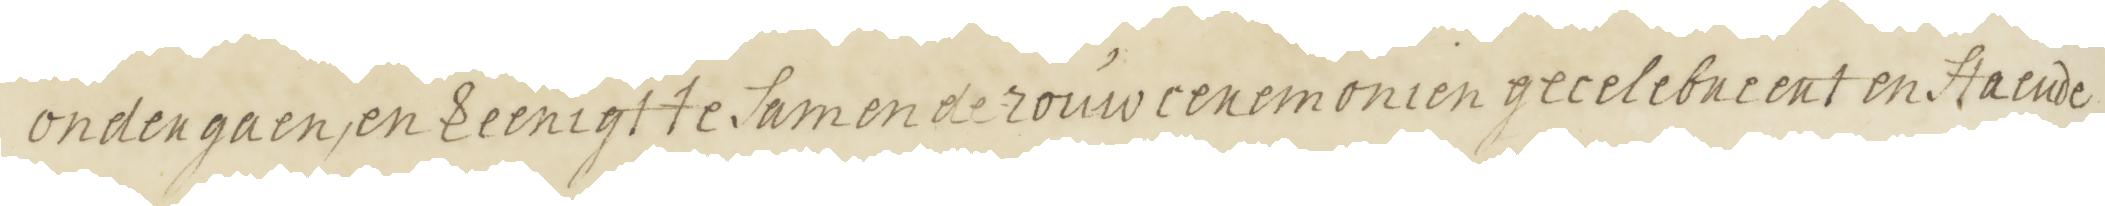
ondergaen, en vereenigt te samen de rouw ceremonien gecelebreert en staende
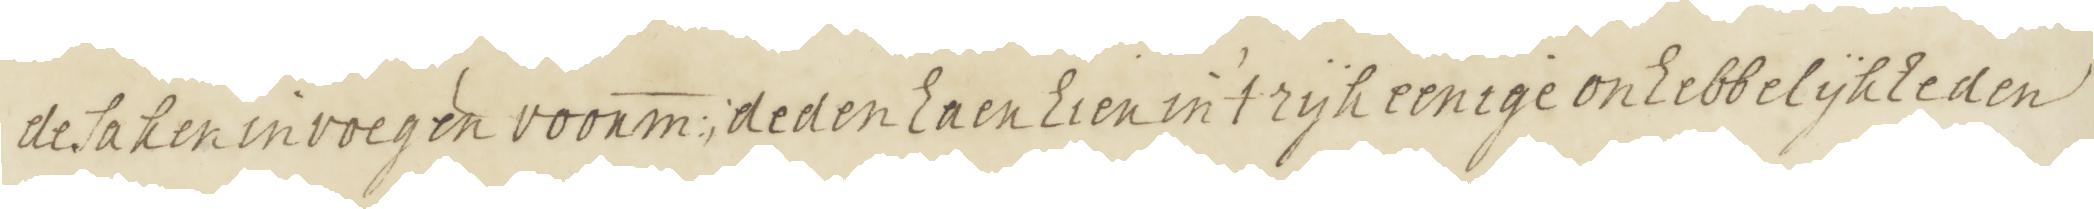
de saken invoegen voorm:, deden haer hier in’t rijk eenige onhebbelijkheden
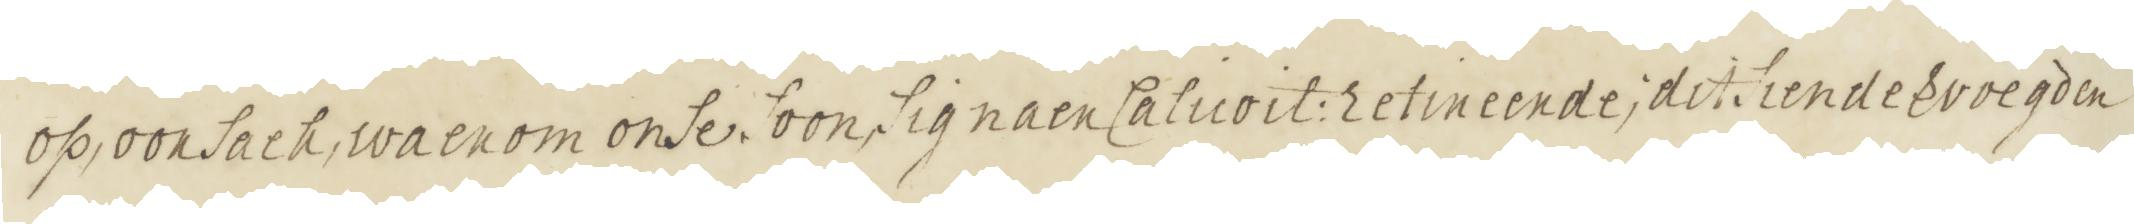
op, oorsaek, waerom onse soon, sig naer Calicoil: retineerde, dit kende vervoegden
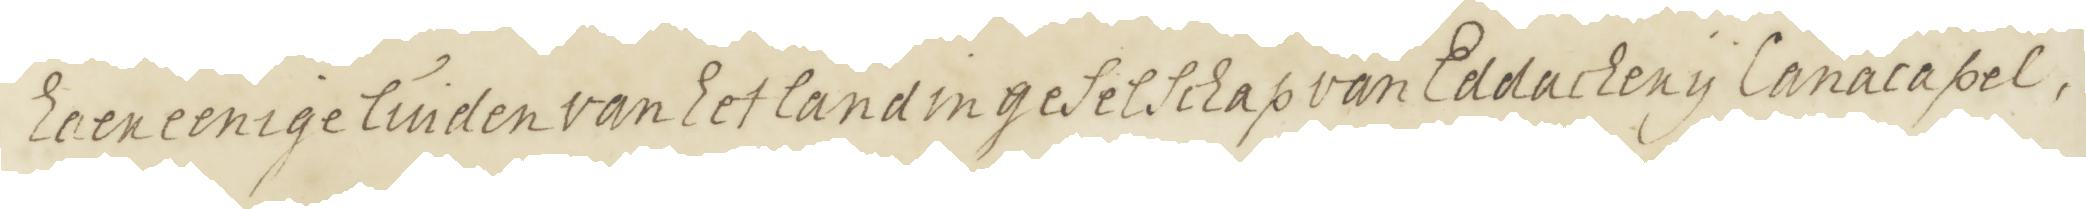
haer eenige luiden van het land in geselschap van Eddacherij Canacapel,
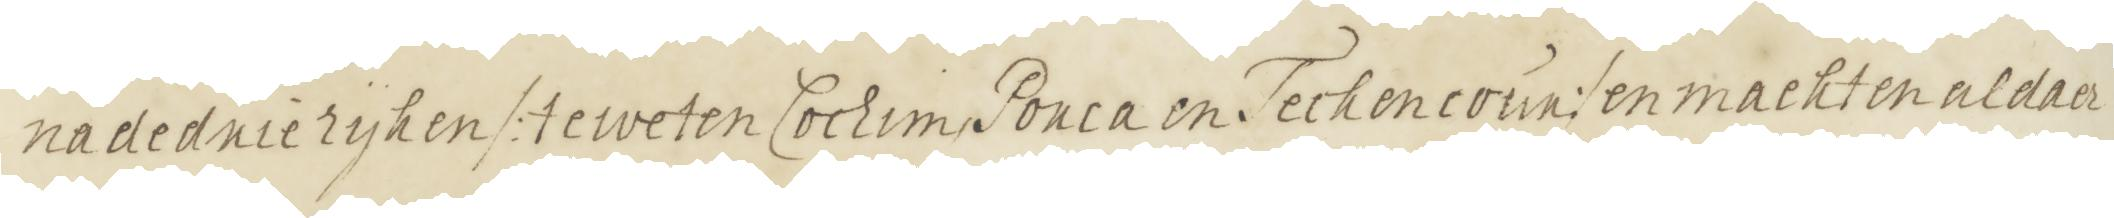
na de drie rijken /:te weten Cochim, Porca en Teckencour:/ en maekten aldaer
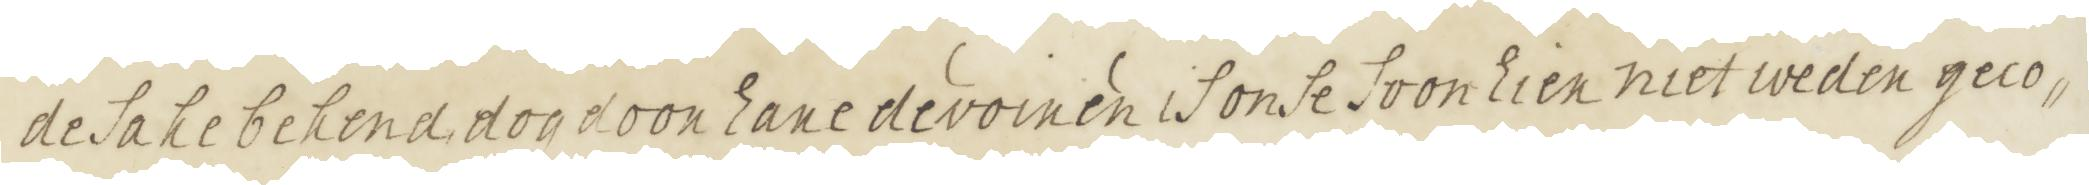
de sake bekend, dog door hare devoiren is onse soon hier niet weder geco„
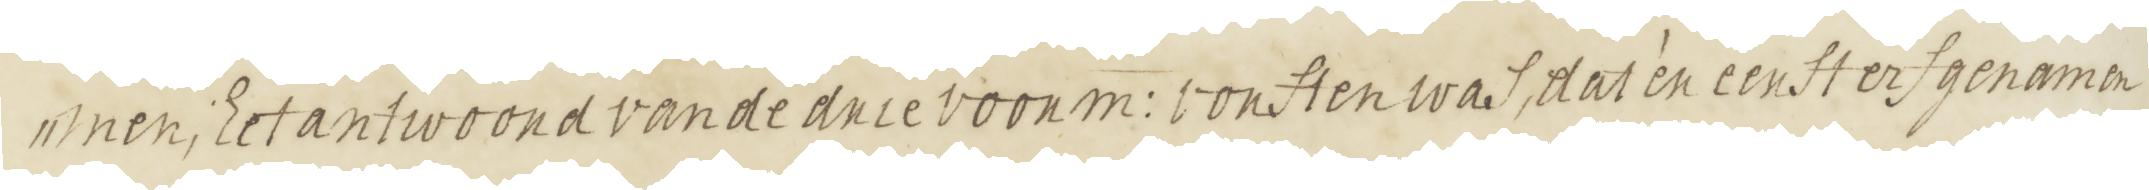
„men, het antwoord van de drie voorm: vorsten was, dat 'er eerst erfgenamen
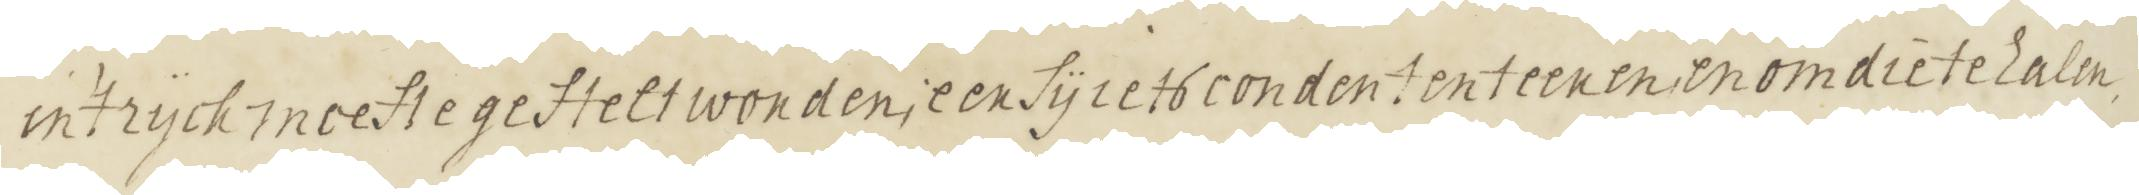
in't rijck moeste gestelt worden; eer sij iets condententeeren, en om die te halen,
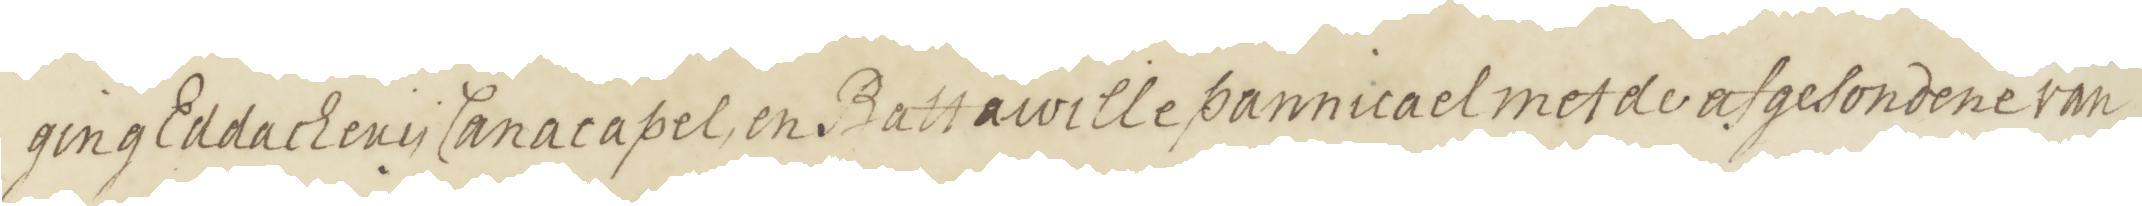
ging Eddacherij Canacapel, en Battawille pannicael met de afgesondene van
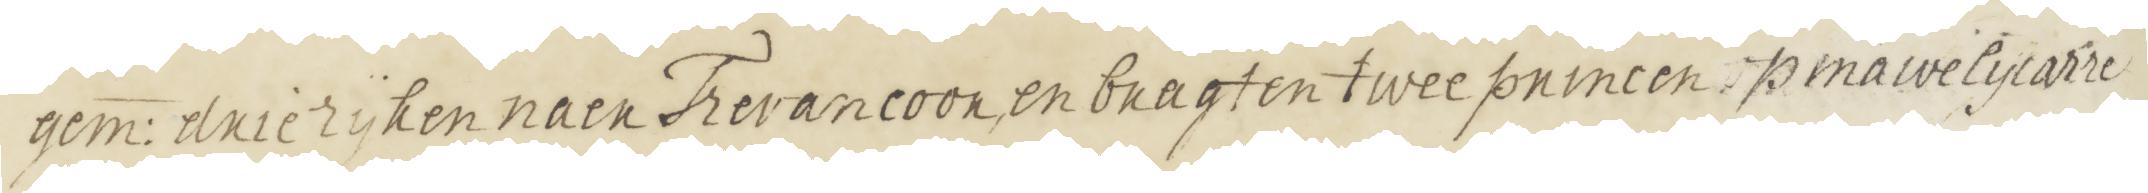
gem: drie rijken naer Trevancoor, en bragten twee princen pinawelijcarre
